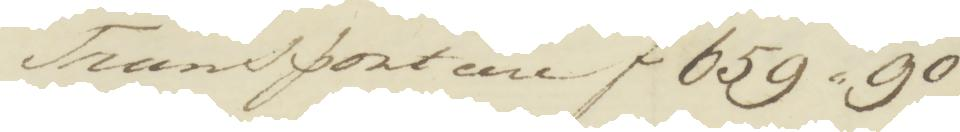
Transporteere ƒ 659 „ 90
